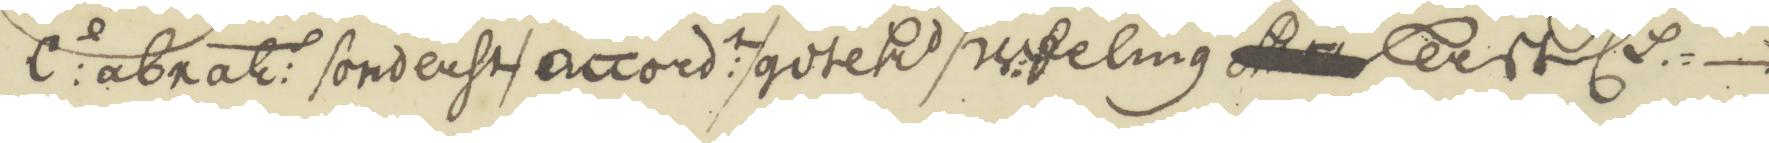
C:s abrah:s /onderst/ accord:t/getekd / w: feling secr Eerst C.s= —
